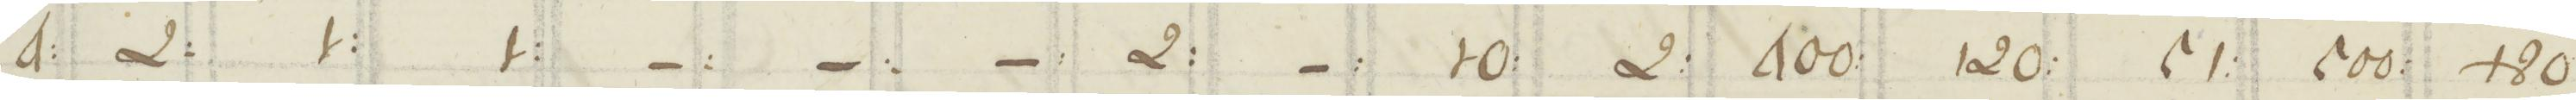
4: 2: 1: 1: _: _: _: 2: _: 10: 2: 400: 120: 51: 500: 180
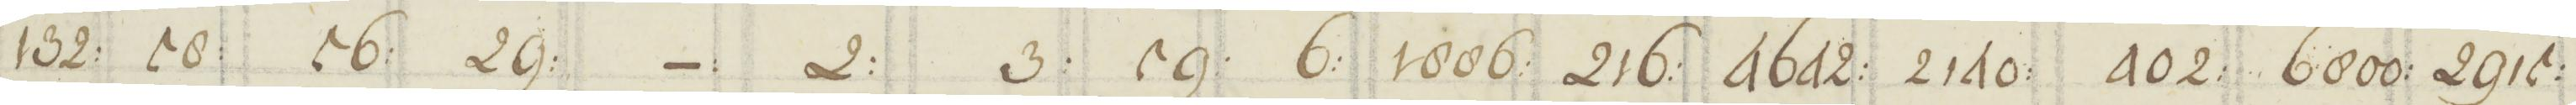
132: 58 56: 29: _: 2: 3: 59: 6: 1886: 216: 4642: 2140: 402: 6800: 2915:
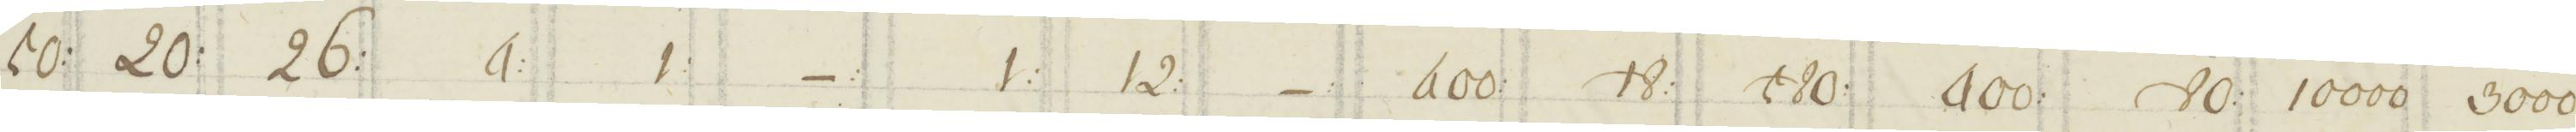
50: 20: 26: 4: 1: _: 1: 12: - 400: 18: 580: 400: 80: 10000 3000
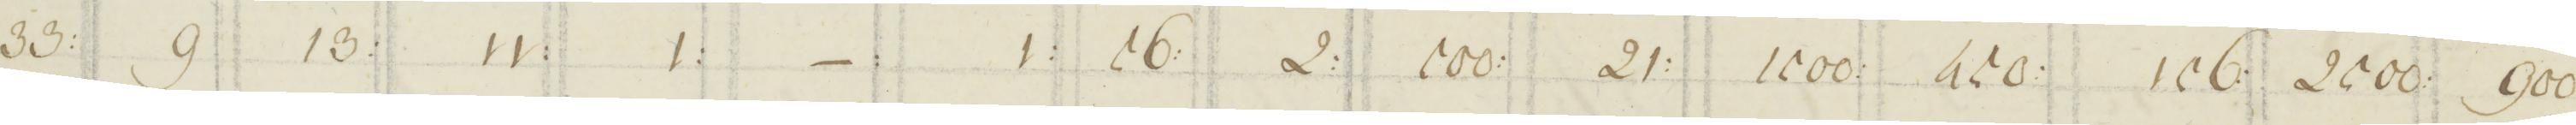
33: 9 13: 11: 1: _. 1: 56: 2: 500: 21: 1500: 450: 156: 2500: 900
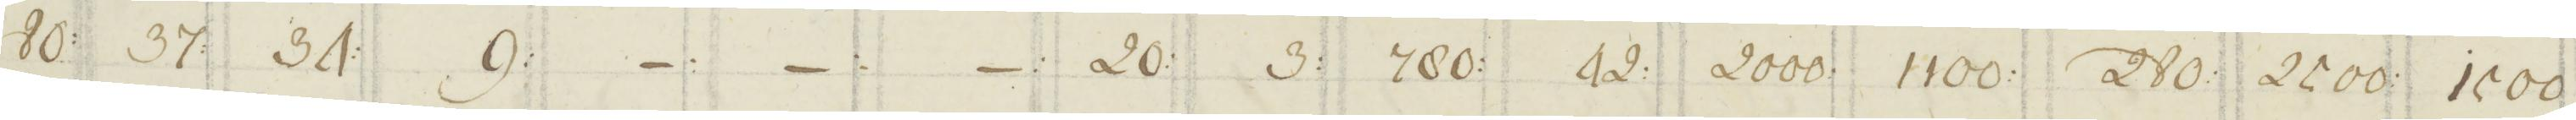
80: 37: 34: 9: _: _: _: 20: 3: 780: 42: 2000: 1100: 280: 2500 1500
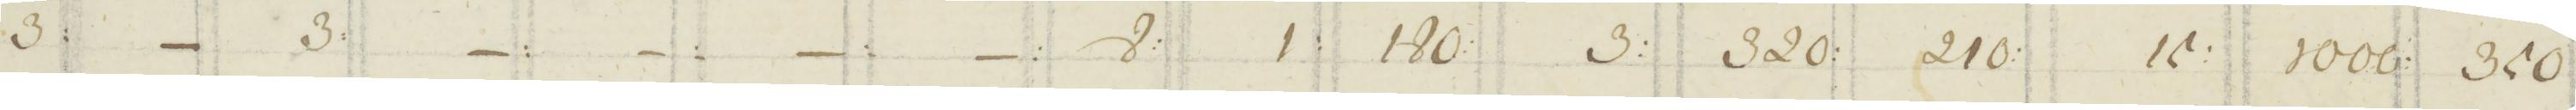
3: _ 3. _ _: _: 8: 1: 180: 3: 320: 210: 15: 1000: 350
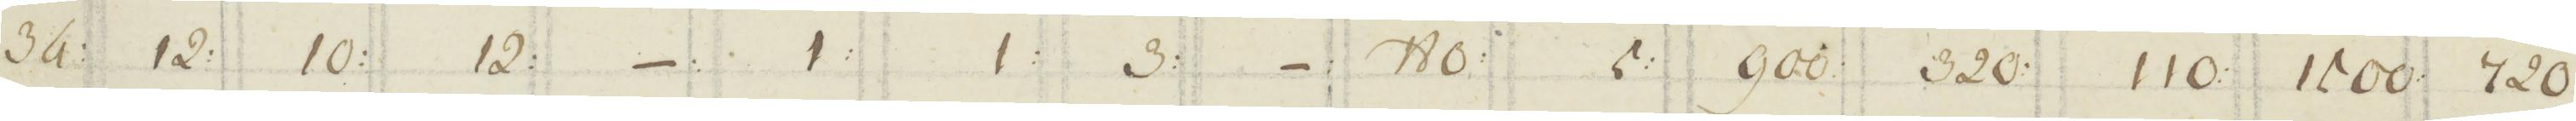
34: 12: 10: 12: _. 1: 1: 3: _. 180: 5: 900 320: 110. 1500: 720
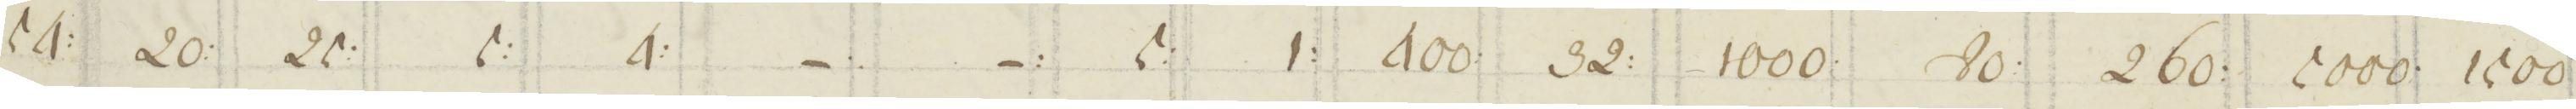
54: 20: 25: 5: 4: _: _: 5: 1: 400: 32: 1000: 80: 260: 5000: 1500
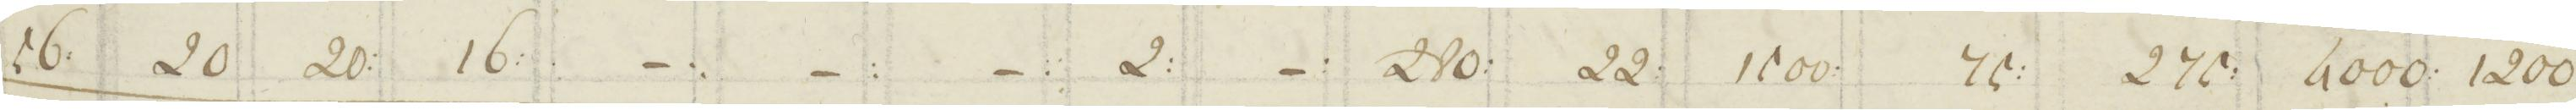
56: 20 20. 16: _: _: _: 2: _: 280: 22. 1500. 75: 275: 4000: 1200
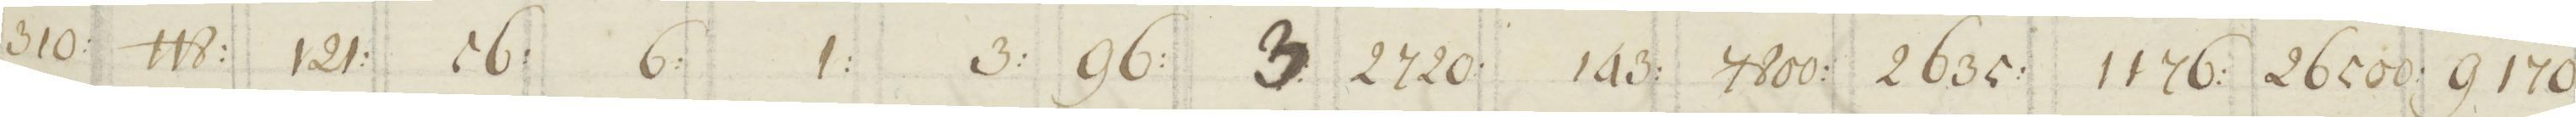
310: 118: 121: 56: 6: 1: 3: 96: 3: 2720: 143: 7800: 2635: 1176: 26500. 9170
